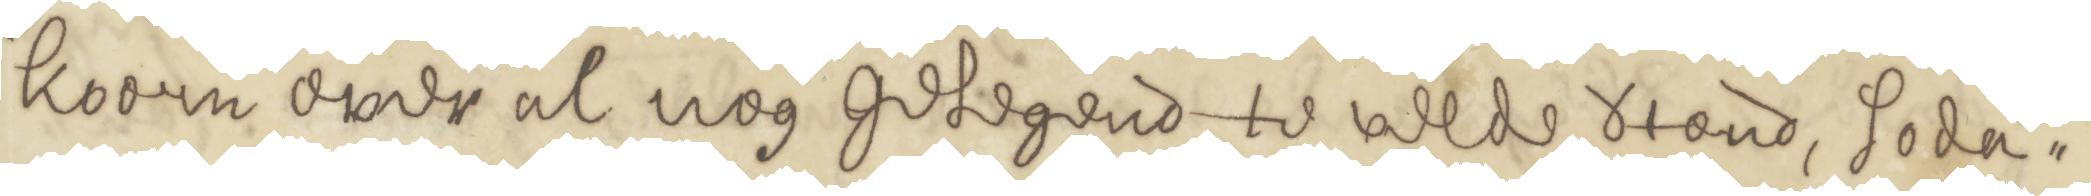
koorn over al nog gesegend te velde stond, soda„
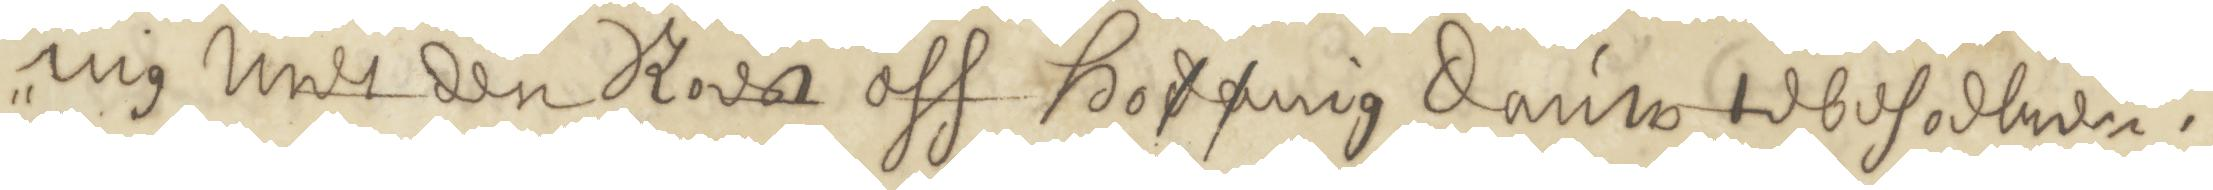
„nig met den Roest off Hodanig dauw te besoeken,
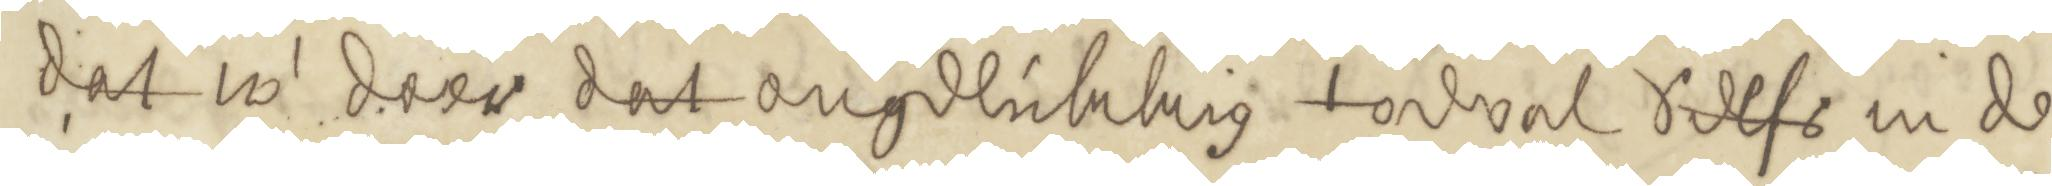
dat w' door dat ongelukkig toeval selfs in de
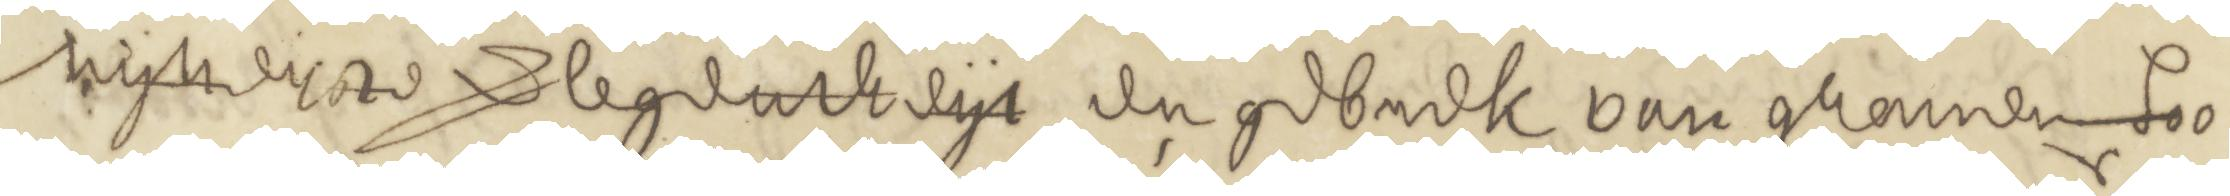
uijtterte verlegentheijt en gebrek van granen soo
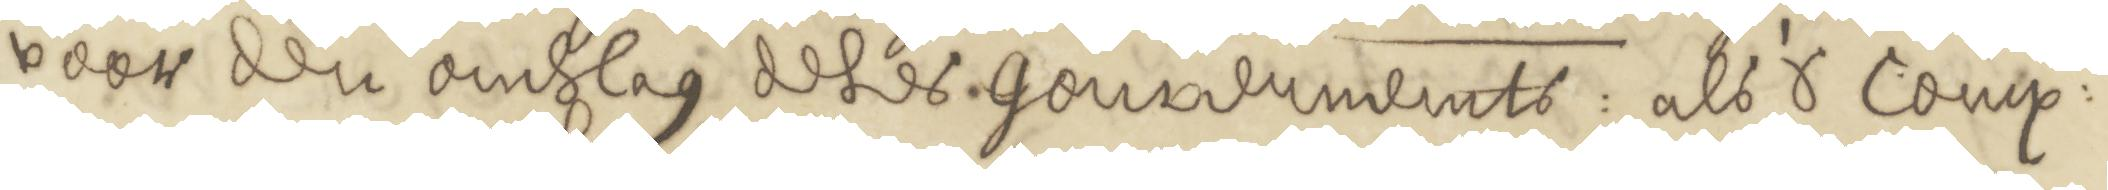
voor den omslag deses gouvernemts: als 's Comp:s
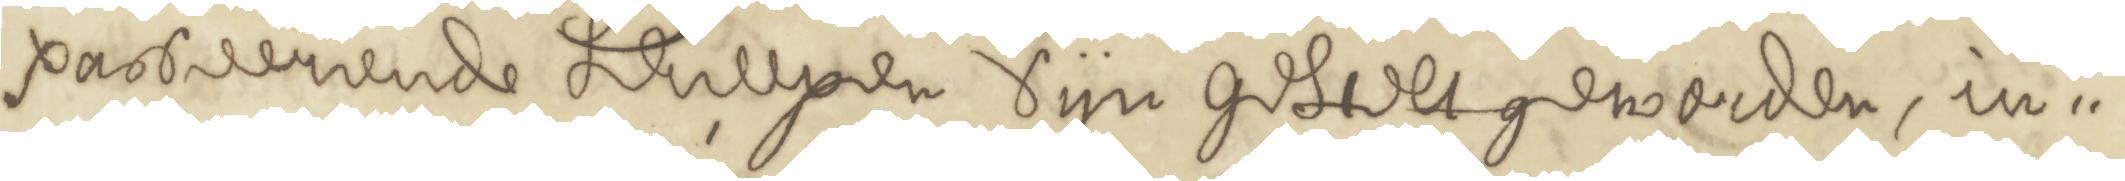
passeerende scheepen sijn gestelt geworden, in„
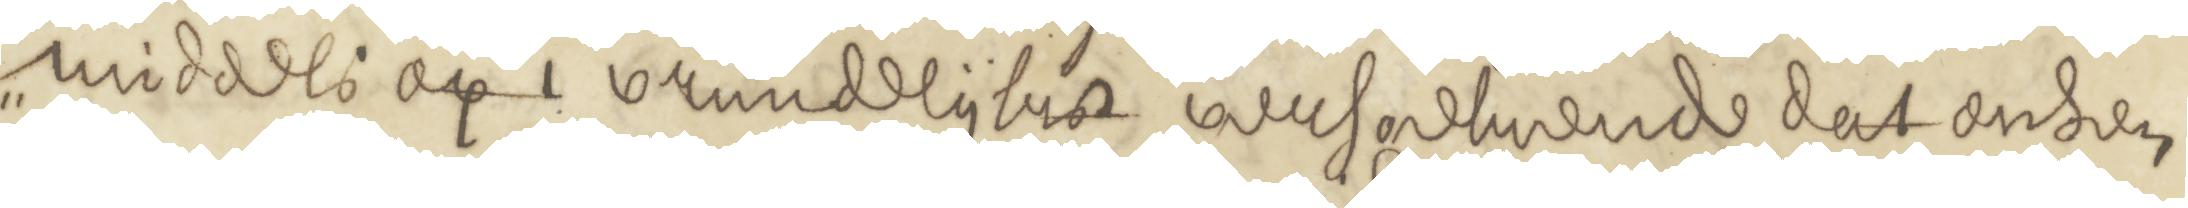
„middels op 't vrundelijkst versoekende dat onsen
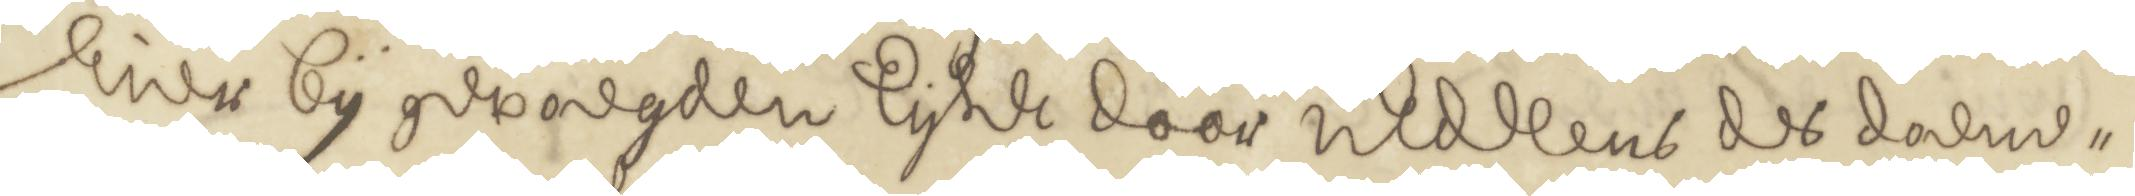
hier bij gevoegden Eijsch door uEdelens des doene„
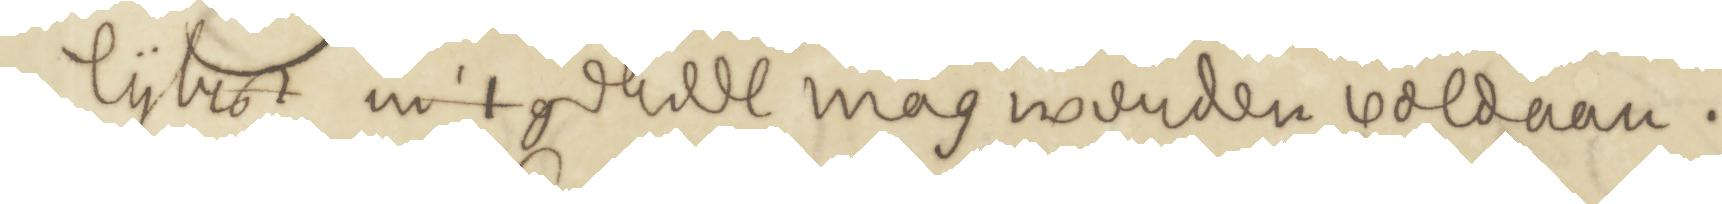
lijkst in ’t geheel mag werden voldaan.
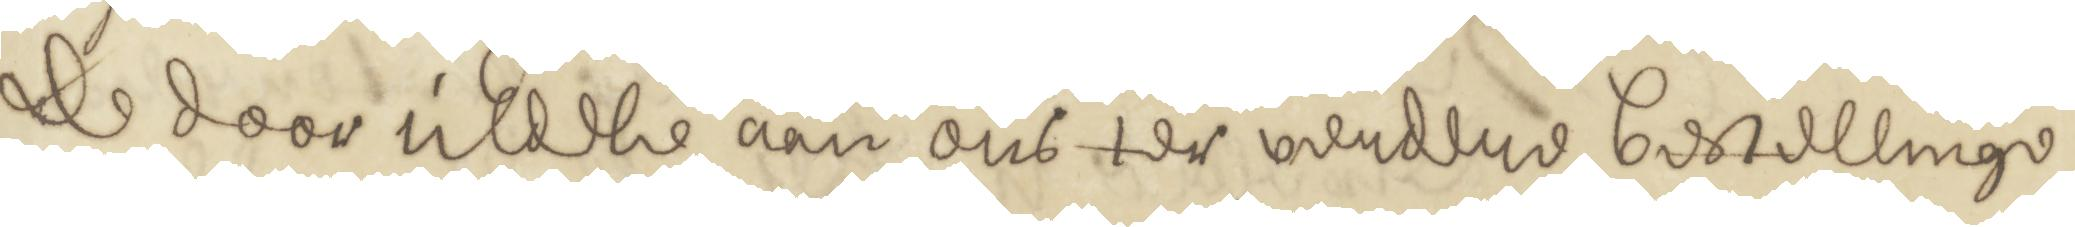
De door uEdele aan ons ter verdere bestellinge
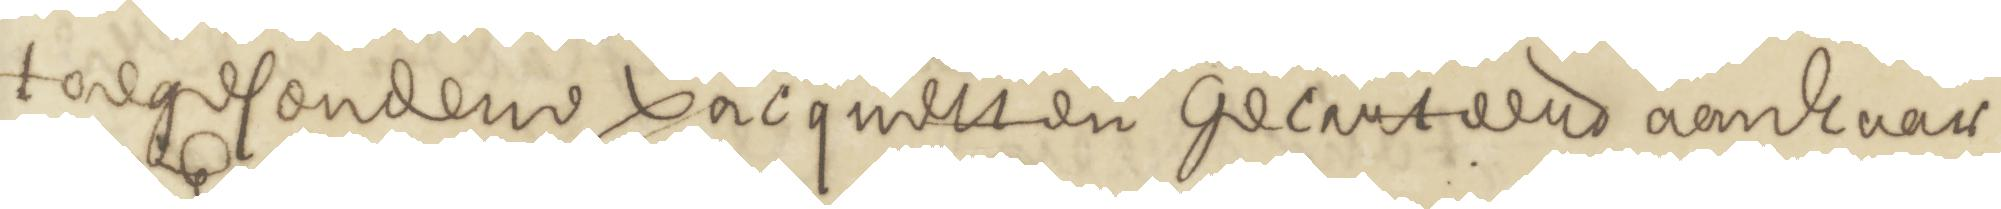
toegesondene pacquetten gecarteerd aan haar
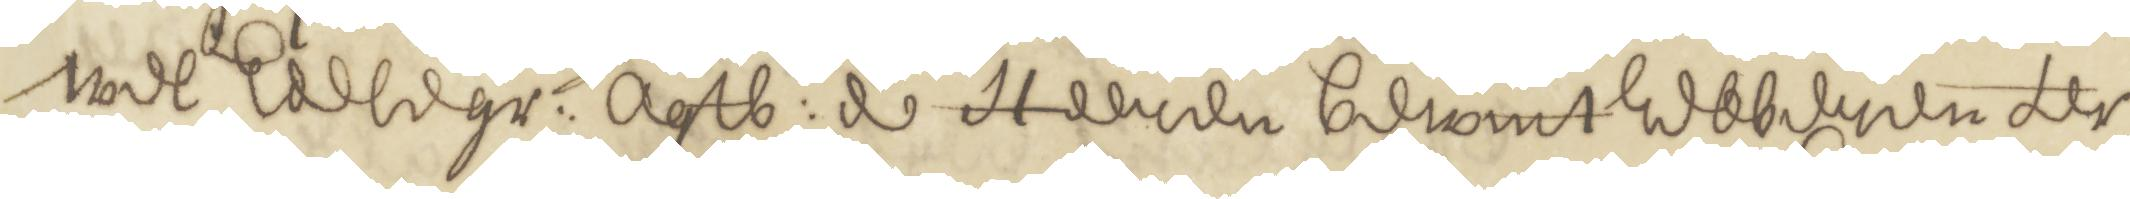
wel Edele gr: Agtb: de Heeren bewinthebberen ter
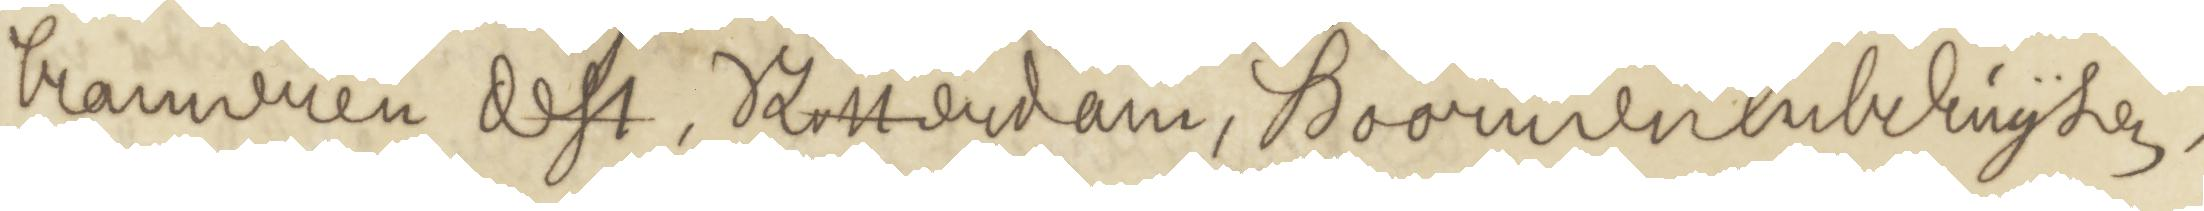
kameren dlft, Rotterdam, Hoorn en Enkhuijsen,
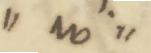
„nu„
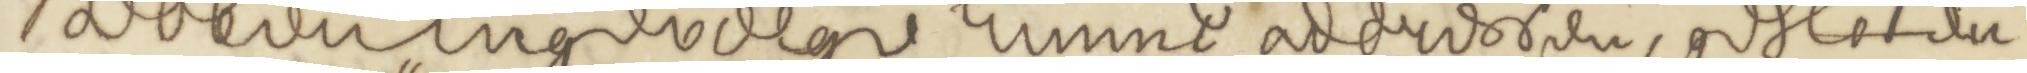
hebben „ ingevolge hunne addressen, gesloten
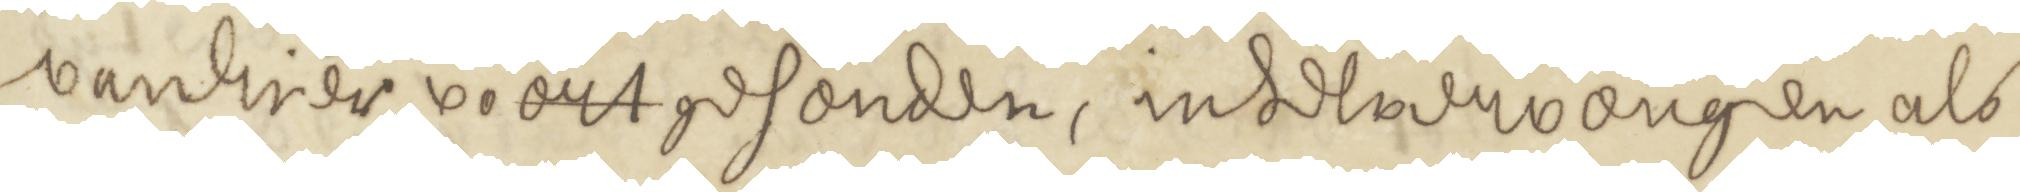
vanhier voort gesonden, inselvervougen als
